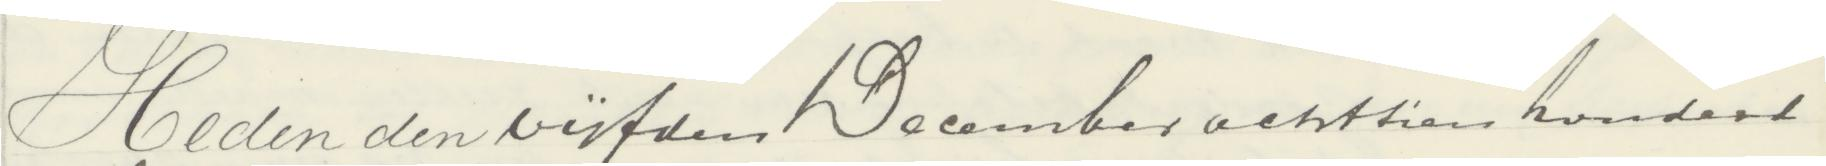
Heden den vijfden December achttien honderd
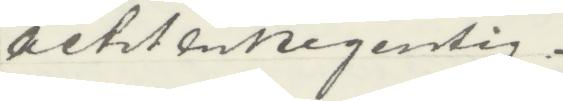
acht en negentig
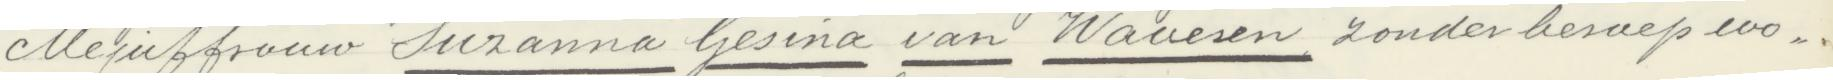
Mejuffrouw Suzanna Gesina van Waveren, zonder beroep wo„
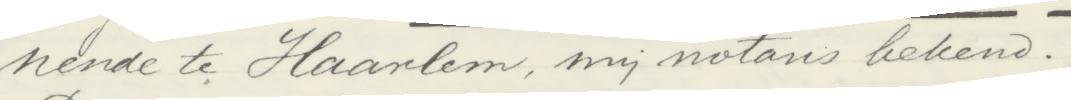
nende te Haarlem, mij notaris bekend.
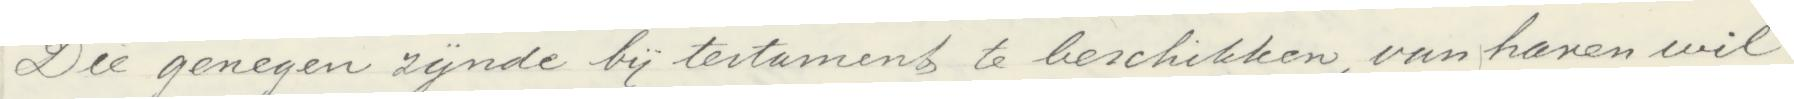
Die genegen zijnde bij testament te beschikken, van haren wil
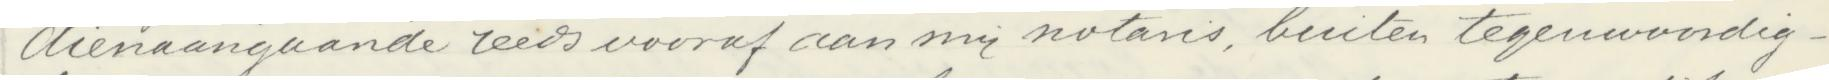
dienaangaande reeds vooraf aan mij notaris, buiten tegenwoordig-
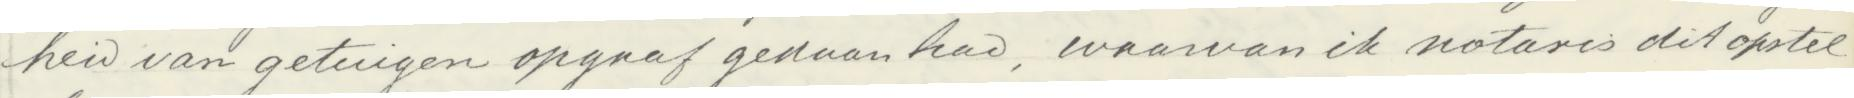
heid van getuigen opgaaf gedaan had, waarvan ik notaris dit opstel
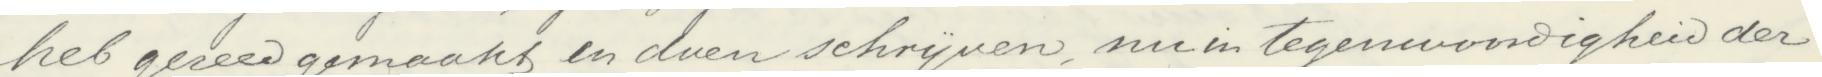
heb gereed gemaakt en doen schrijven, nu in tegenwoordigheid der
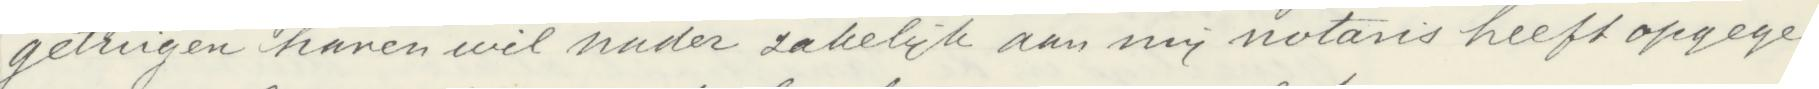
getuigen haren wil nader zakelijk aan mij notaris heeft opgege
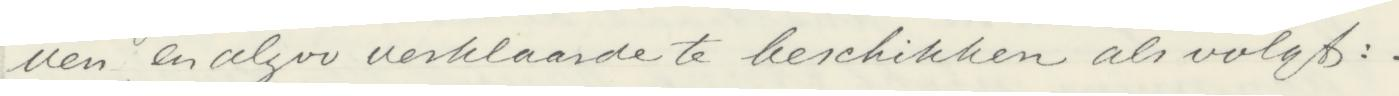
ven en alzoo verklaarde te beschikken als volgt:
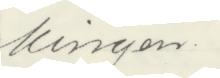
kingen.
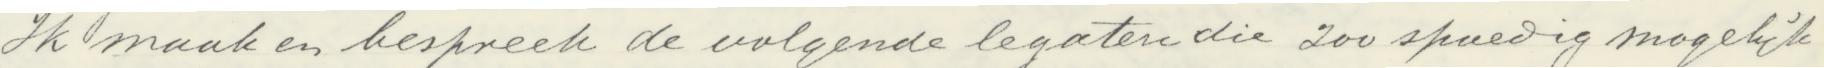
Ik maak en bespreek de volgende legaten die zoo spoedig mogelijk
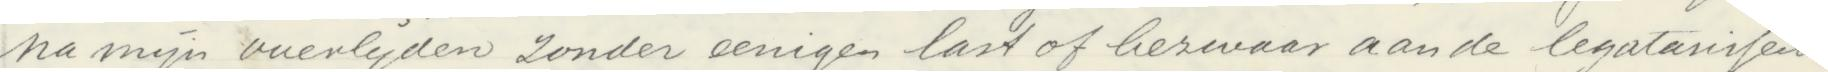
na mijn overlyden zonder eenigen last of bezwaar aan de legatarissen
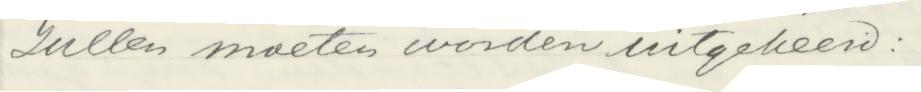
zullen moeten worden uitgekeerd:
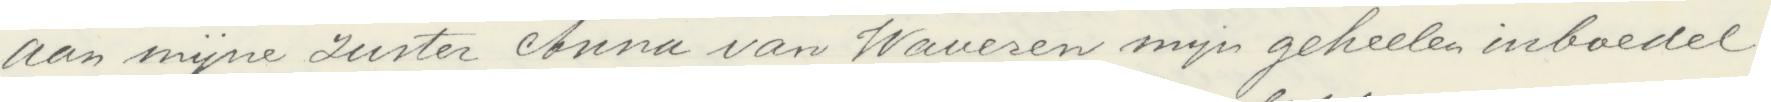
aan mijne zuster Anna van Waveren mijn geheelen inboedel
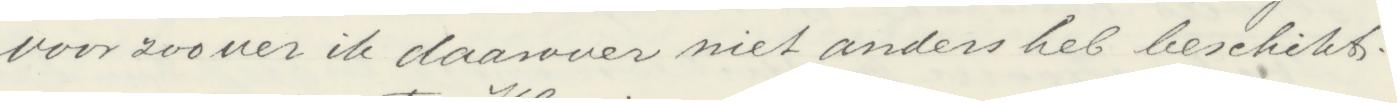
voor zoo ver ik daarover niet anders heb beschikt.
